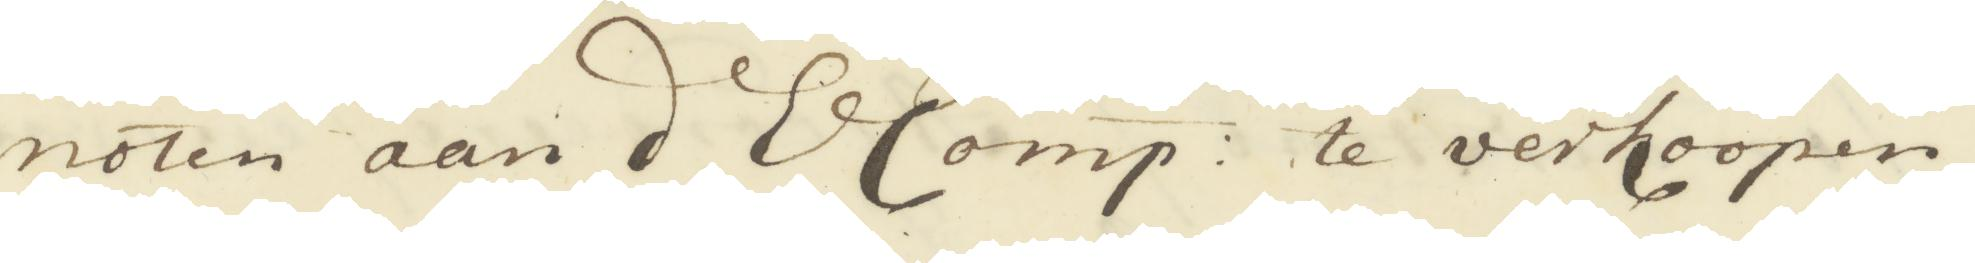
noten aan d E Comp: te verkoopen
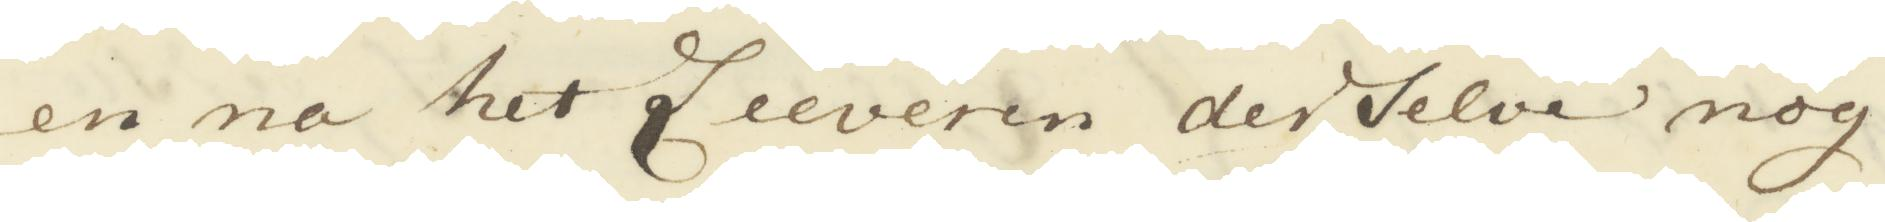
en na het Leeveren derselve nog
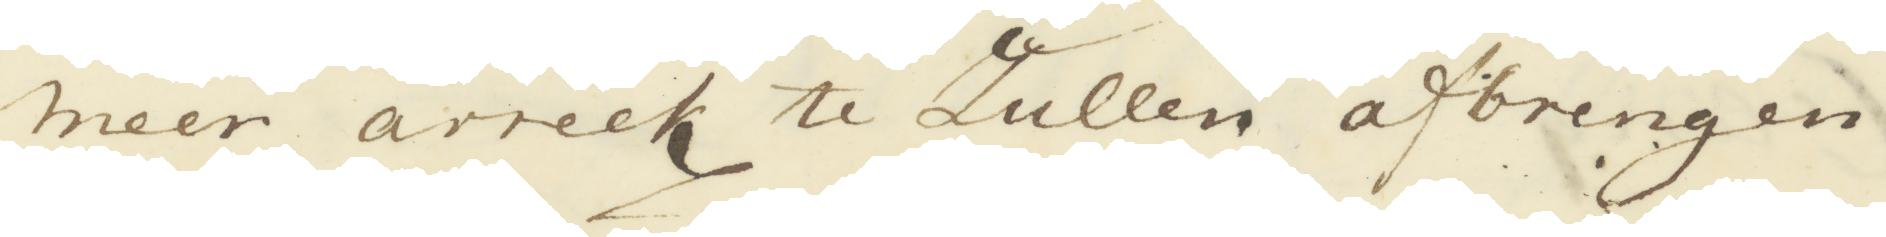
meer arreek te zullen afbrengen
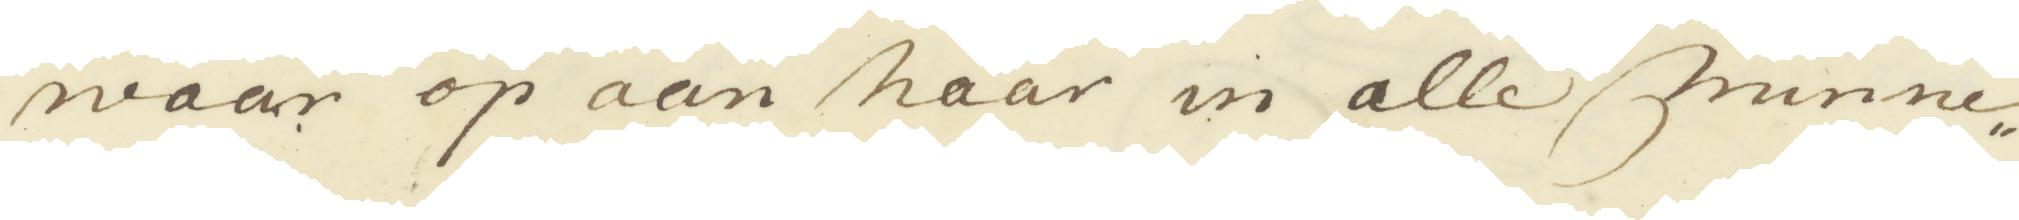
waar op aan haar in alle minne„
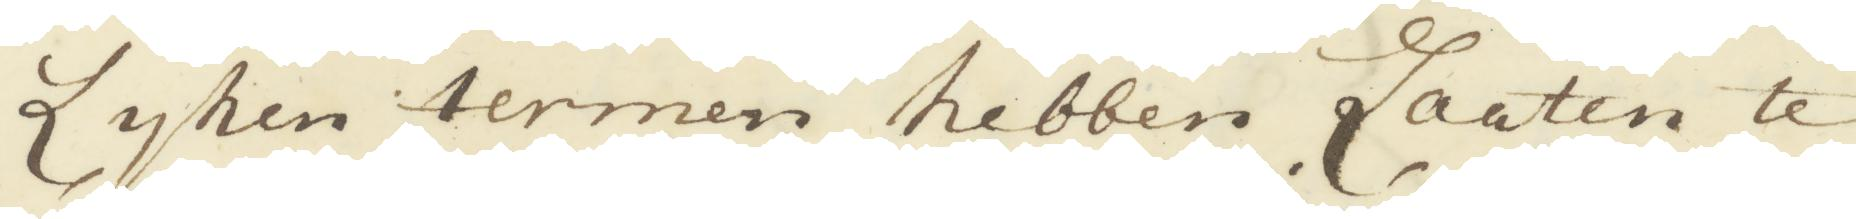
Lyken termen hebben Laaten te
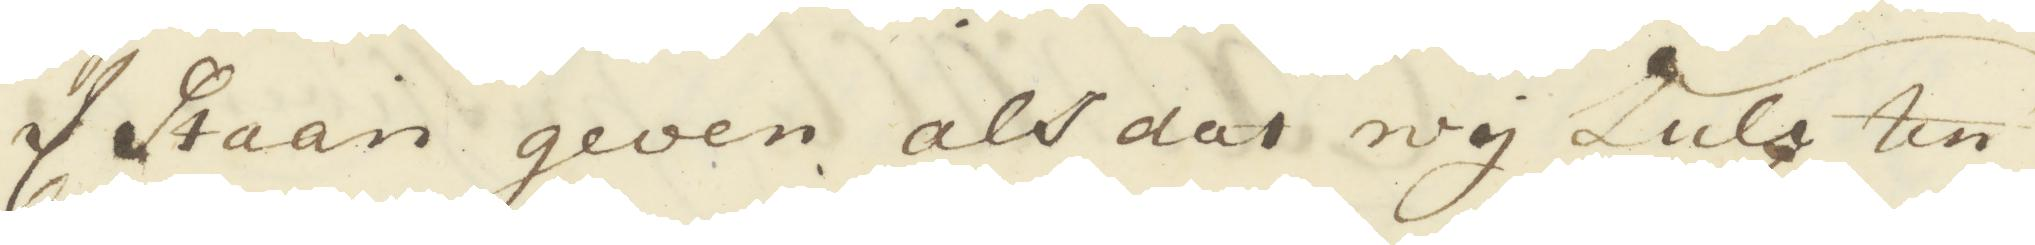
verstaan geven als dat wij zulx ten
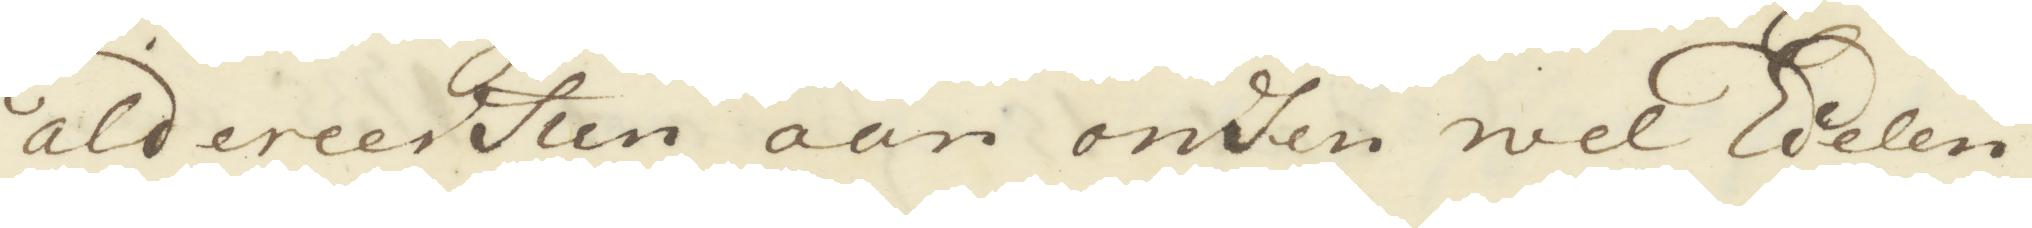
aldereersten aan onsen wel Edelen
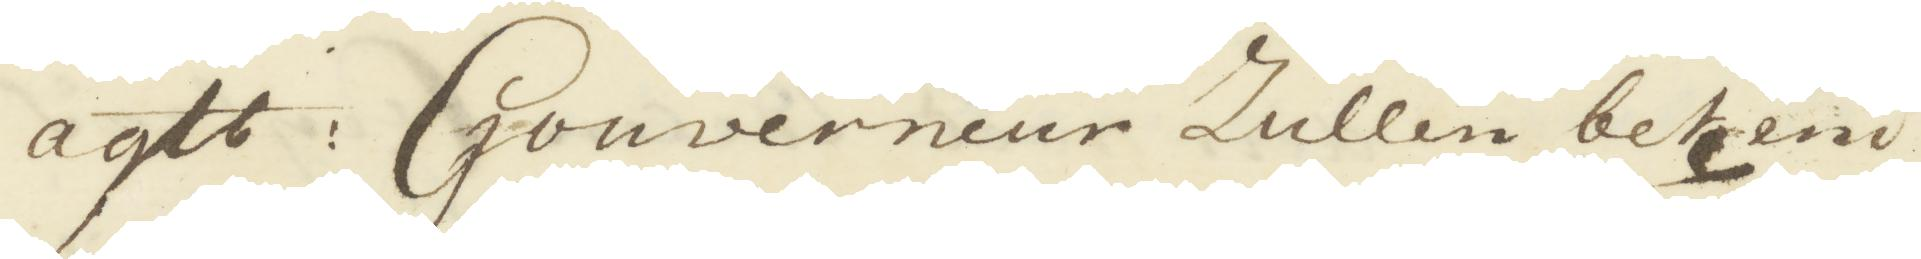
agtb: Gouverneur zullen bekend
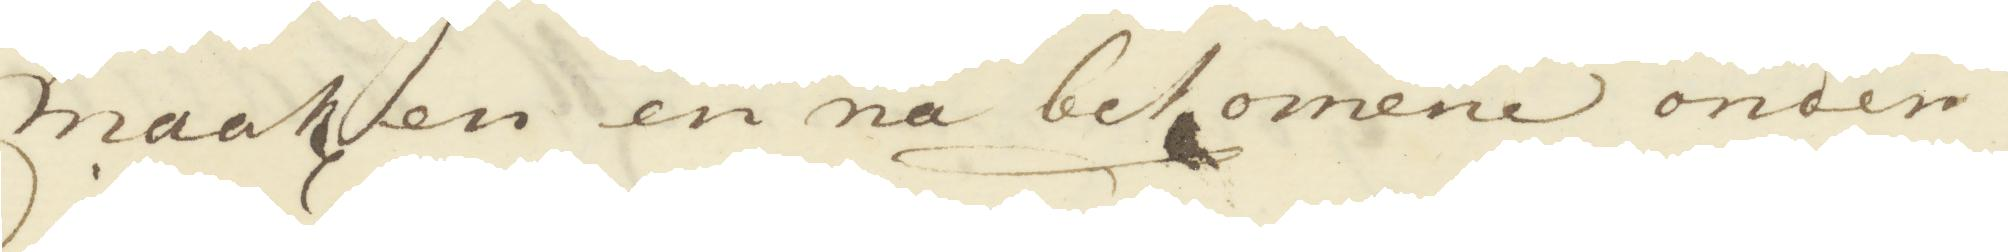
maaken en na bekomene onder
